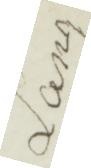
Lang
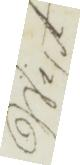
Wijt
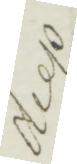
diep
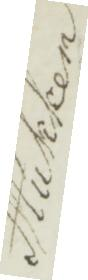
stukken
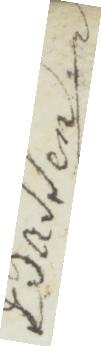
Bassen
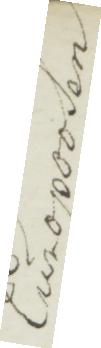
Europoosen
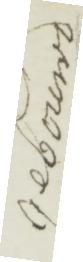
gebouwd
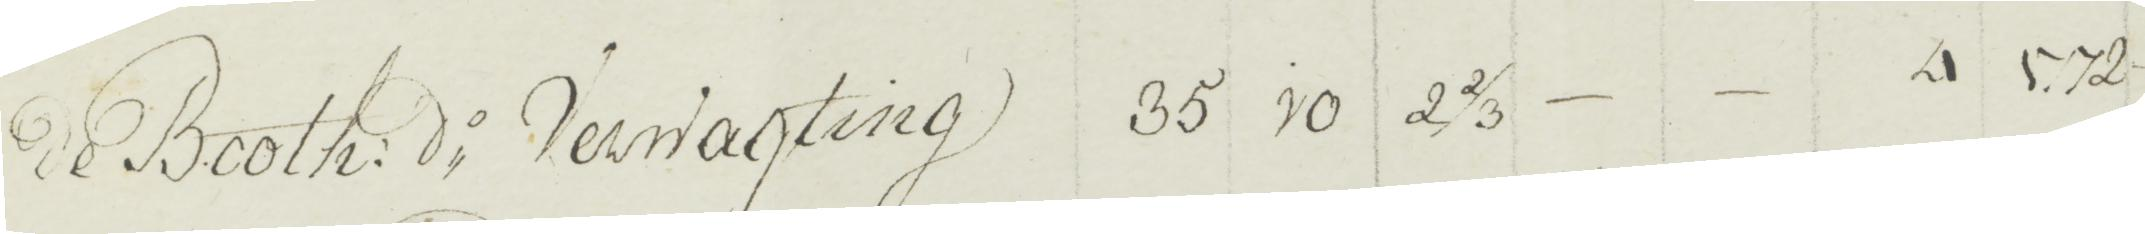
de Booth: d„o Verwagting 35 10 2 2/3 — — 4 5.72
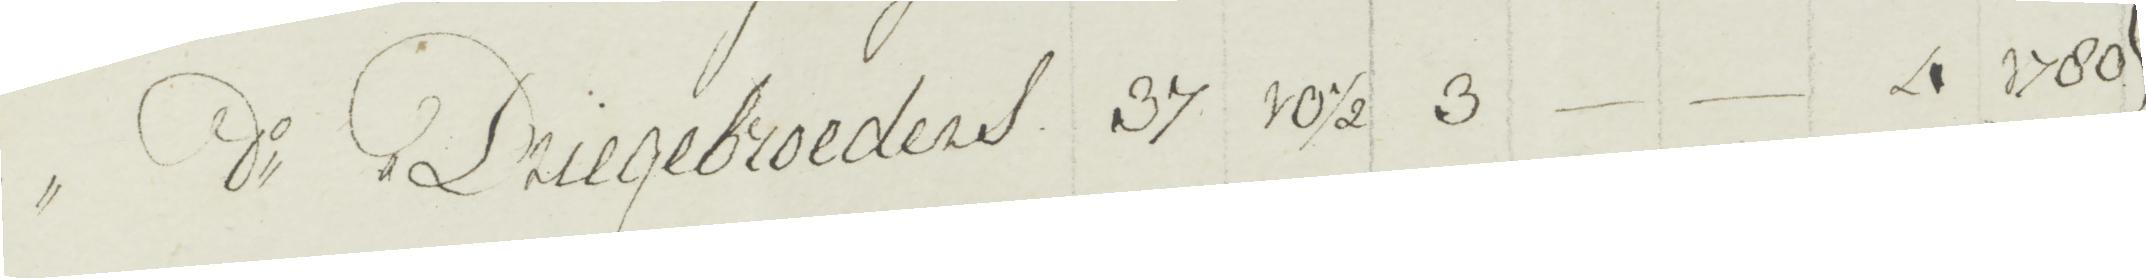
„ d„o „ Driegebroeders. 37. 10½ 3 — — 4 1780
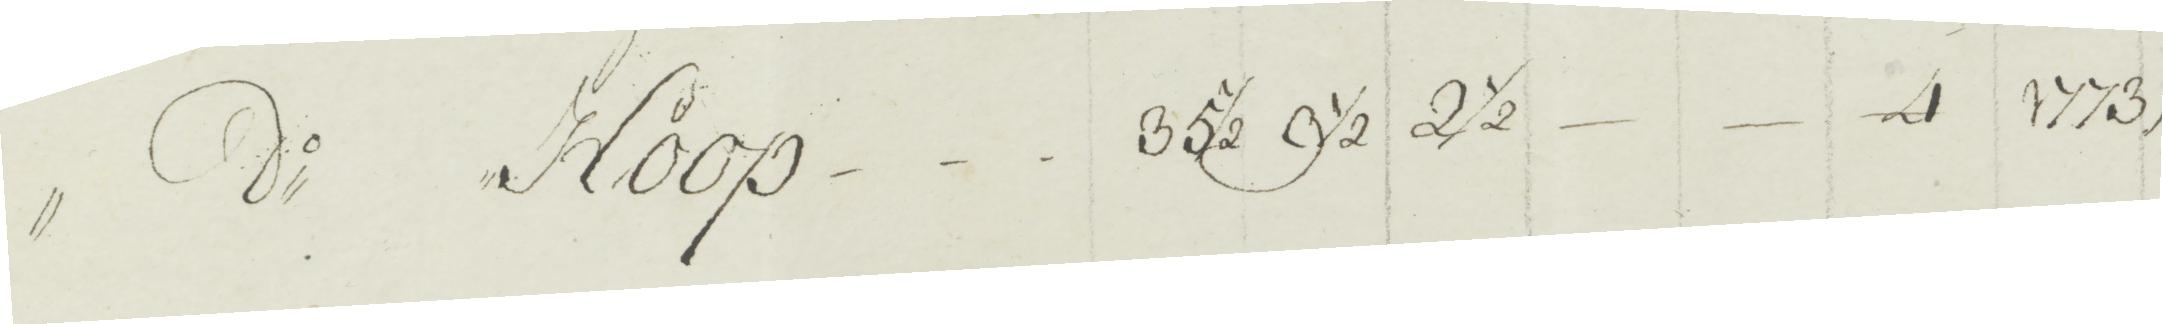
„ d„o Hoop – – - 35½ 9½ 2½ — — 4 1773
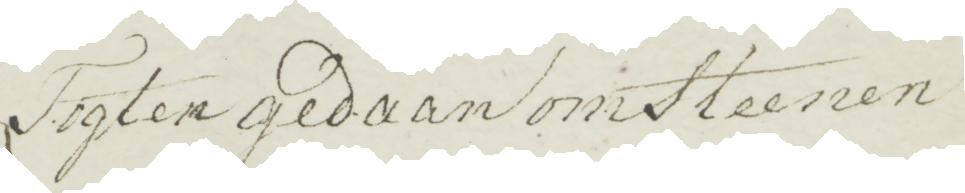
Togten gedaan om steenen
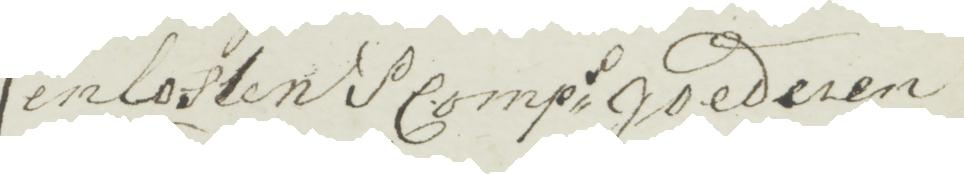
en losten ’s Comp„s goederen
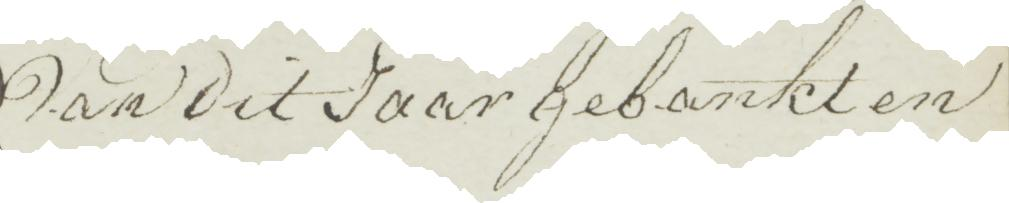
Van dit Iaar gebankt en
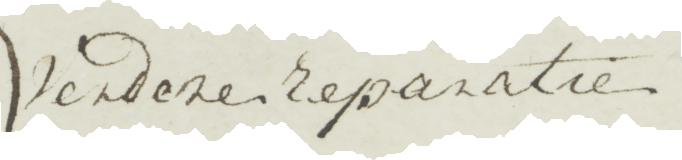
verdere reparatie
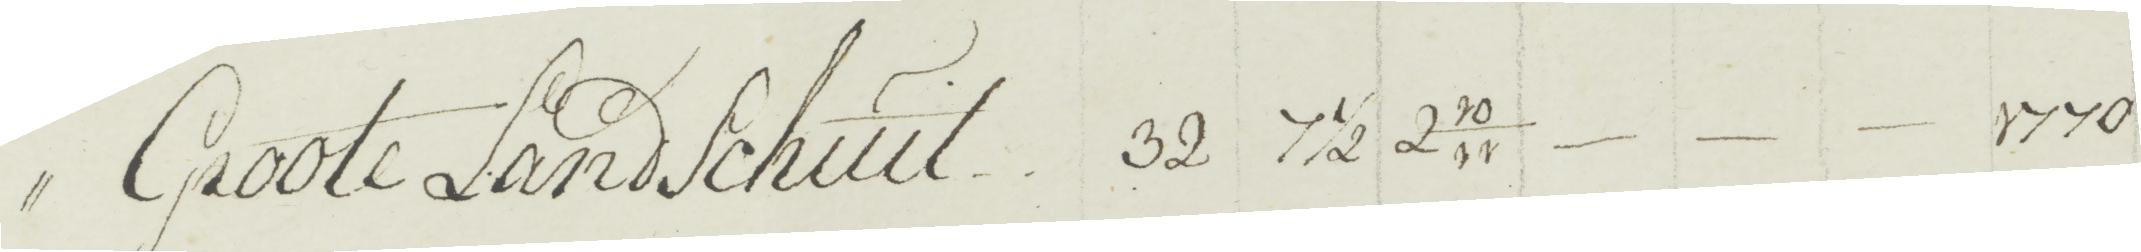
„ Groote Landschuit . . 32 7½ 2 10/11 — — — 1770
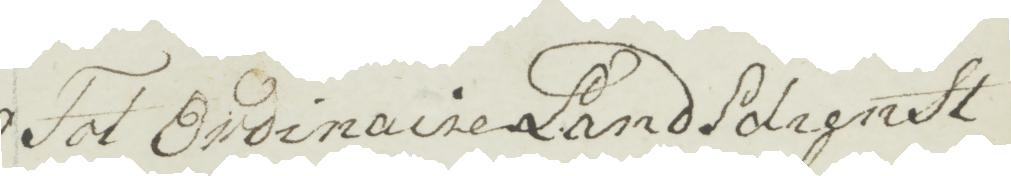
Tot Ordinaire Landsdienst
